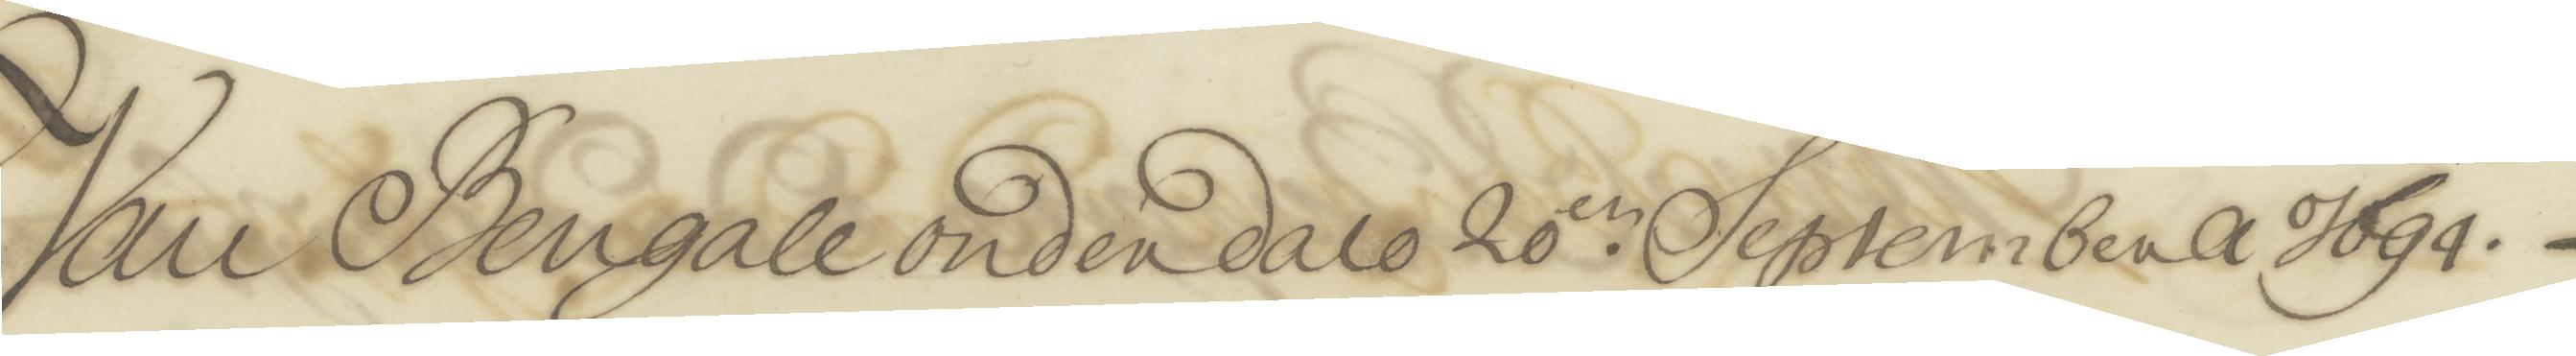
Van Bengale onder dato 20.en September ao1694.
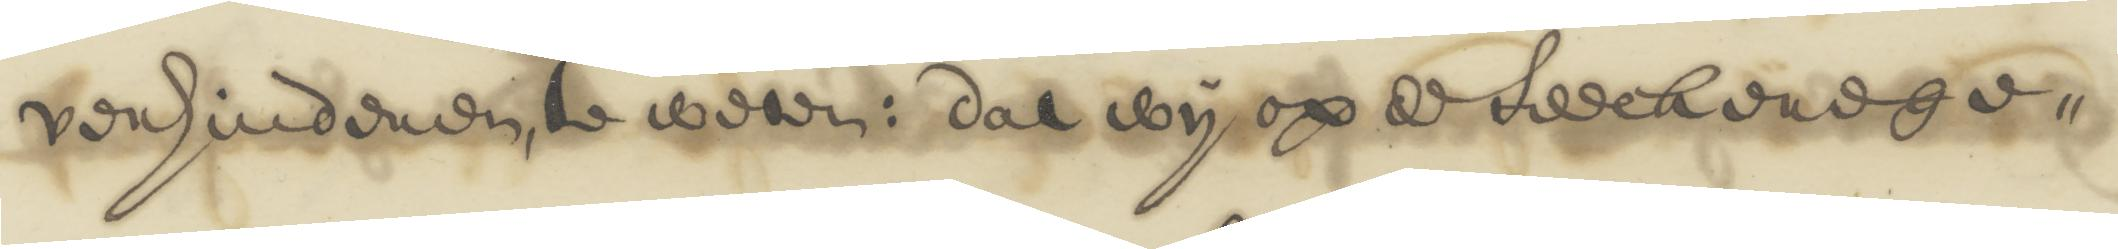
verhinderen, te weten: dat wij op de seeckere ge„
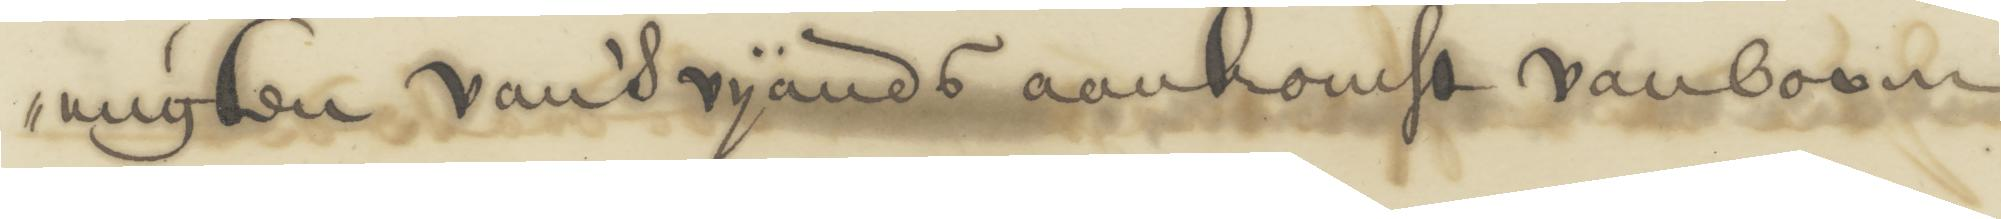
„rugten van 's vijands aankomst van boven
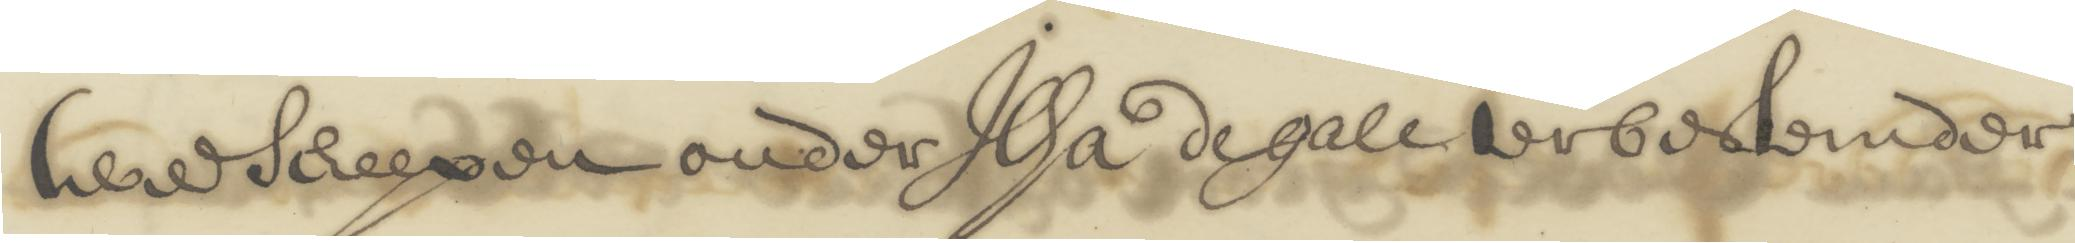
twee scheepen onder Jlha de gale ter bestemder
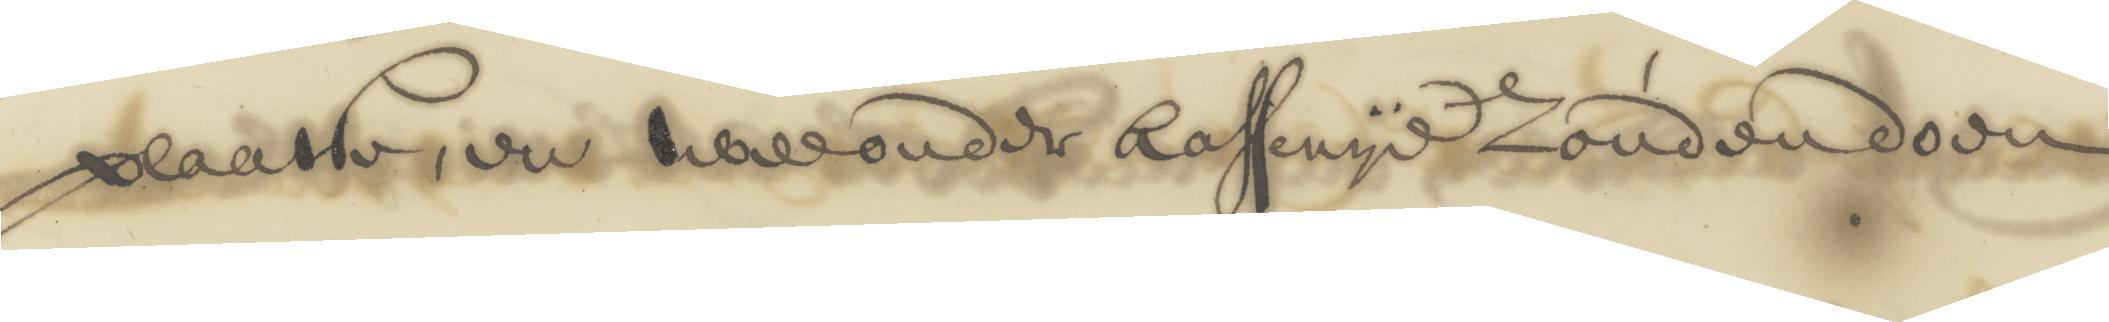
plaatse, en twee onder kassenije zouden doen
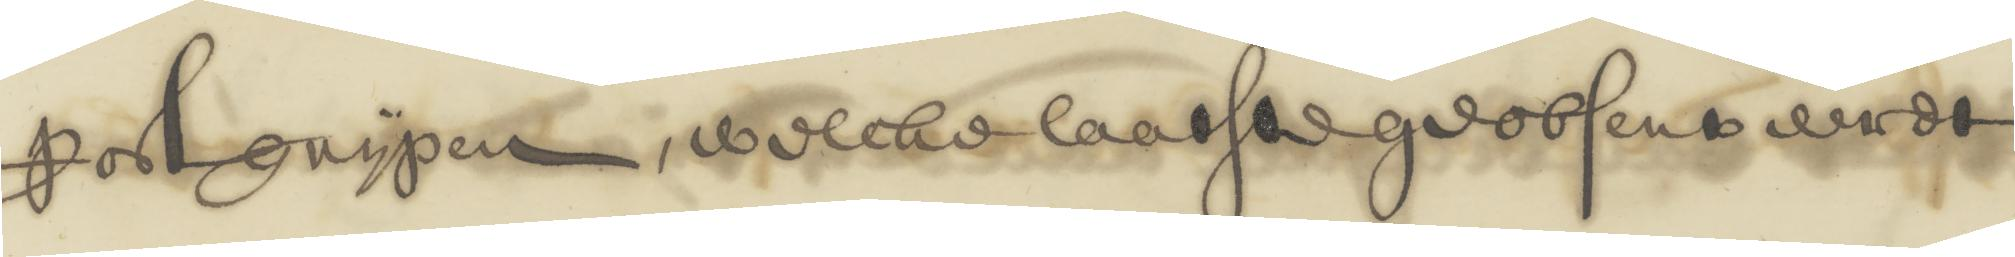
postgrijpen, welcke laatste geobserveerdt
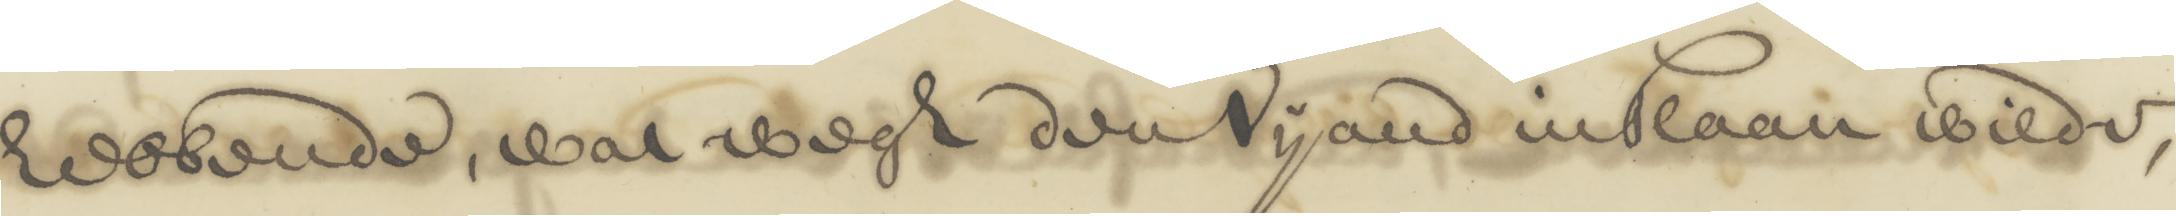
hebbende, wat wegh den vijand inslaan wilde,
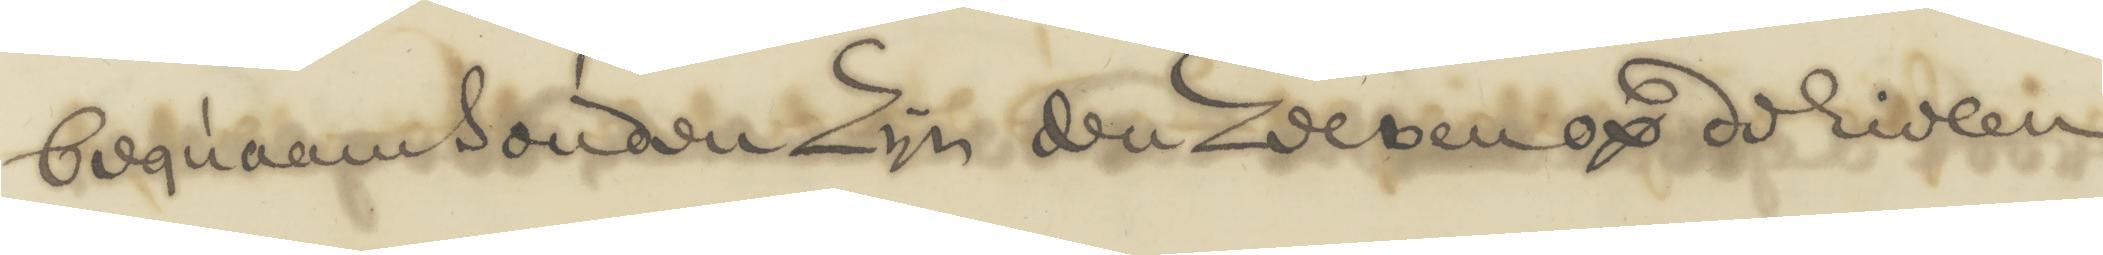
bequaam souden zijn den zelven op de hielen
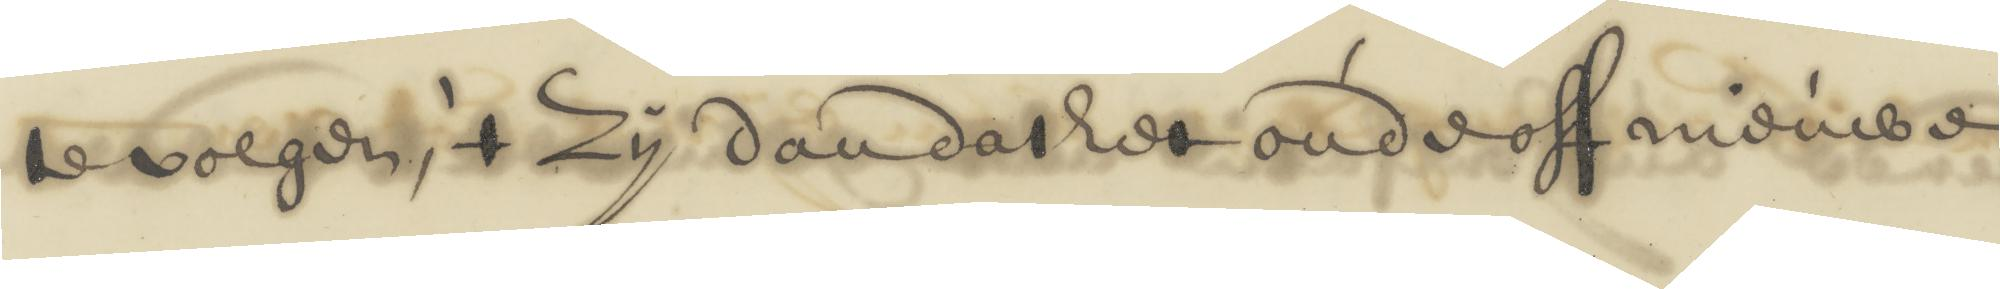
te volgen, ’t zij dan dat het oude off nieuwe
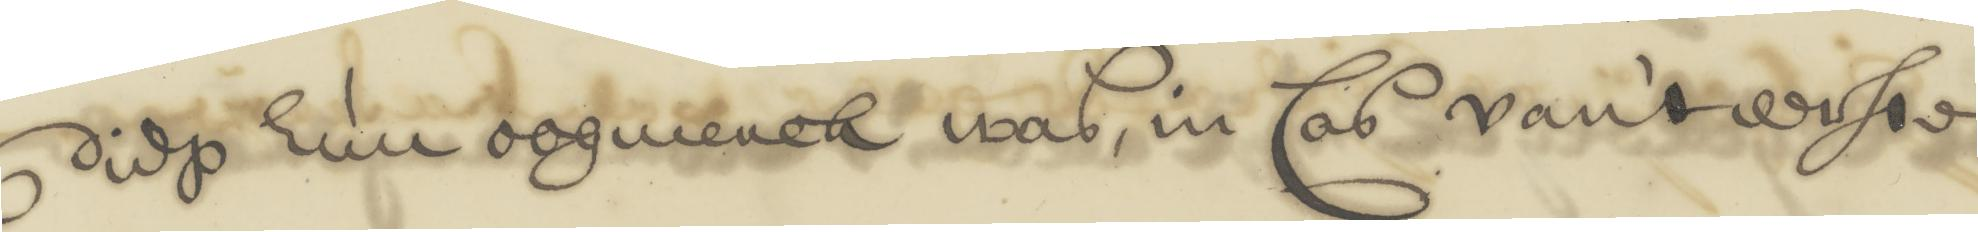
diep hun oogmerck was, in Cas van ’t eerste,
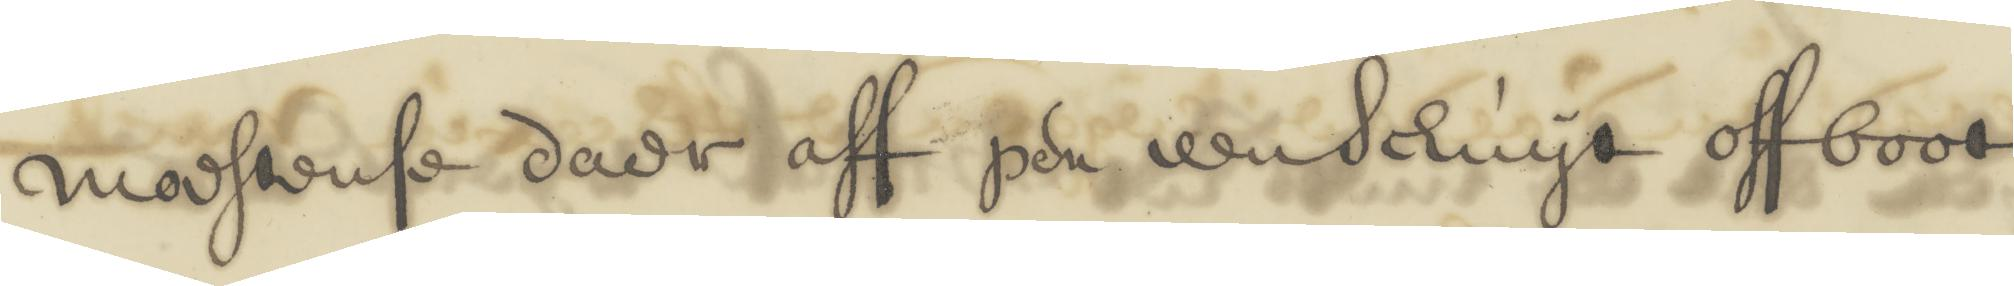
moestense daer aff per een schuijt off boot
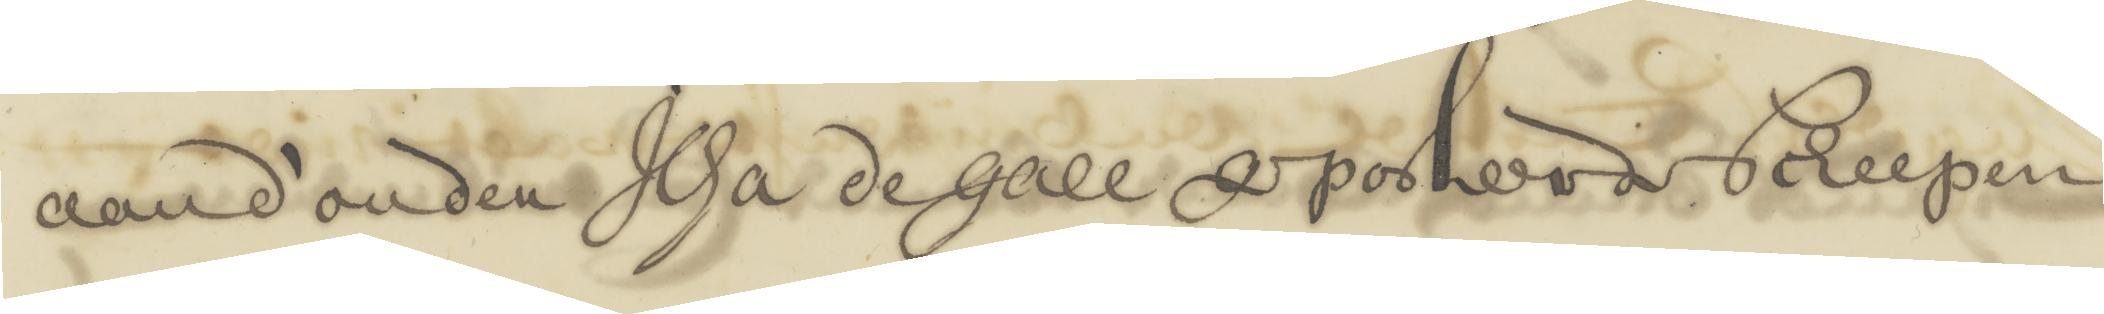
aan d’onder Jlha de gale geposteerde scheepen
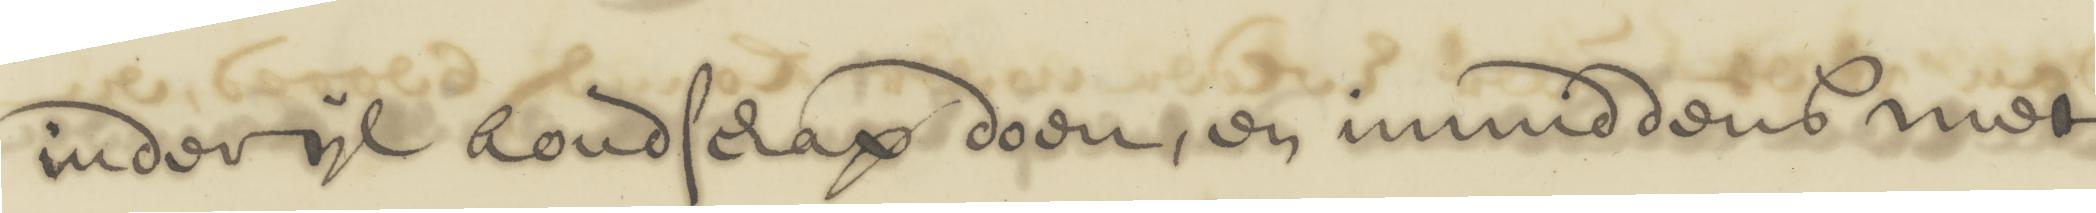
inderijl kondschap doen, en inmiddens met
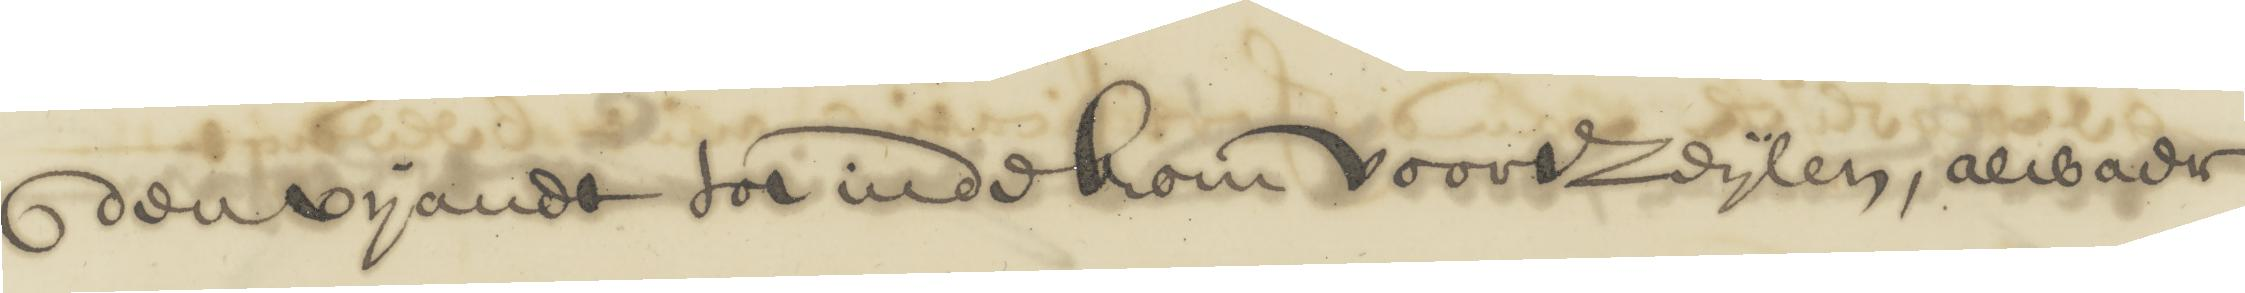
den vijandt tot inde kom voortzeijlen, alwaer
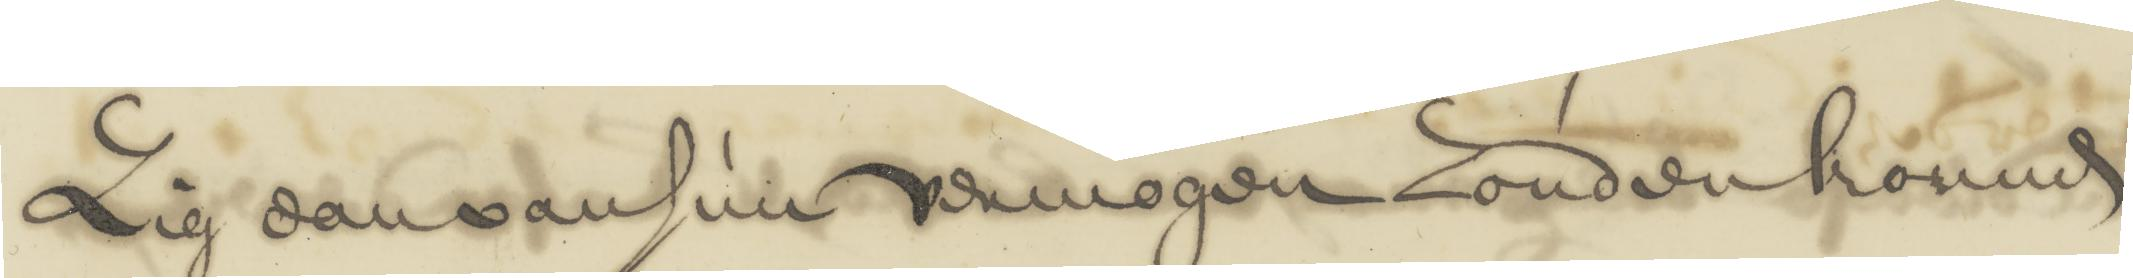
zig dan van hun vermogen zouden konnen
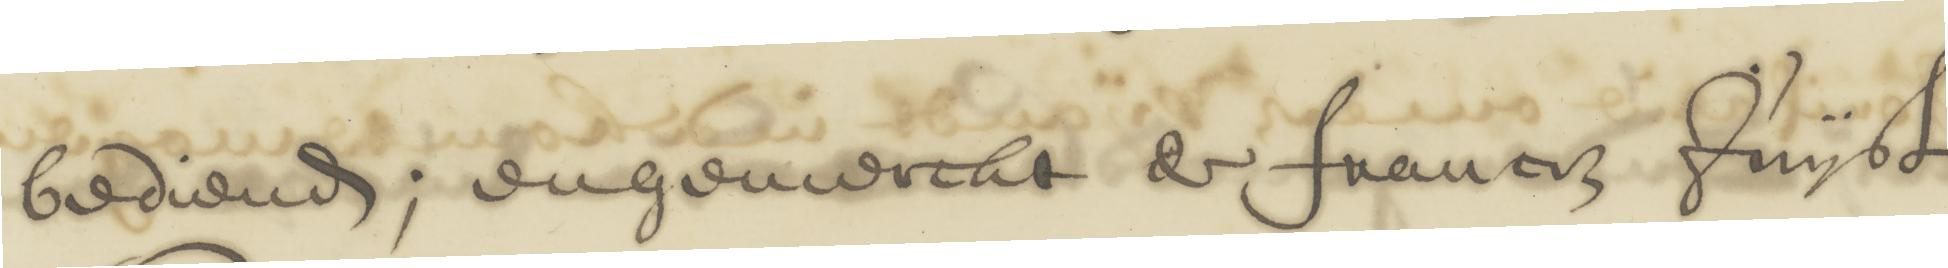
bedienen; en gemerckt de francen Juijst
